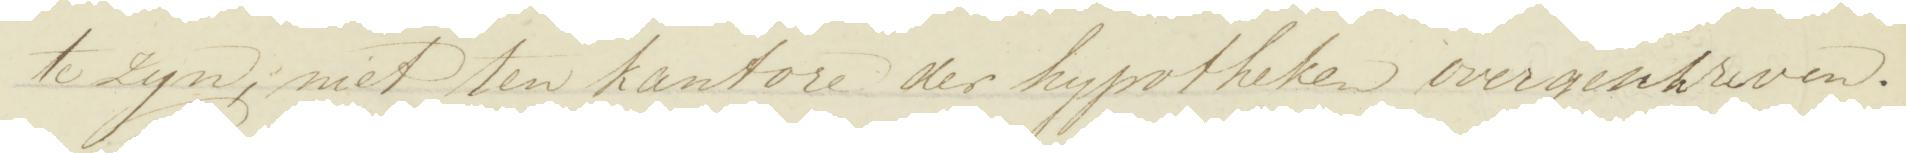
te zyn, niet ten kantore der hypotheken overgeschreven.
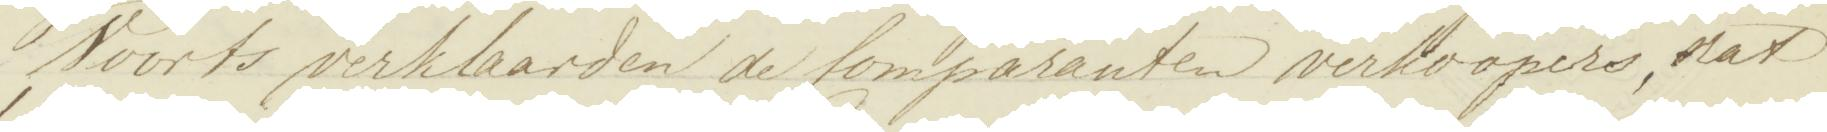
Voorts verklaarden de comparanten verkoopers, dat
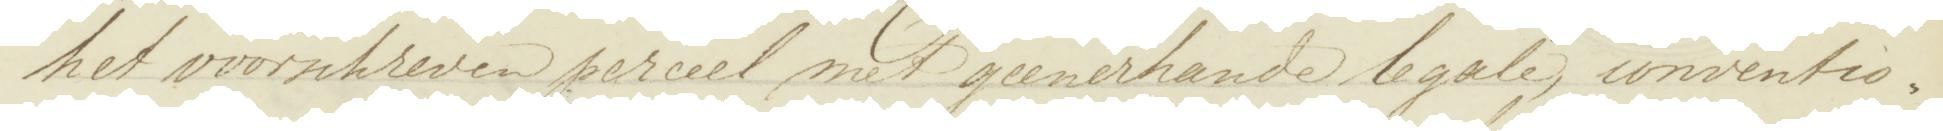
het voorschreven perceel met geenerhande legale, conventio„
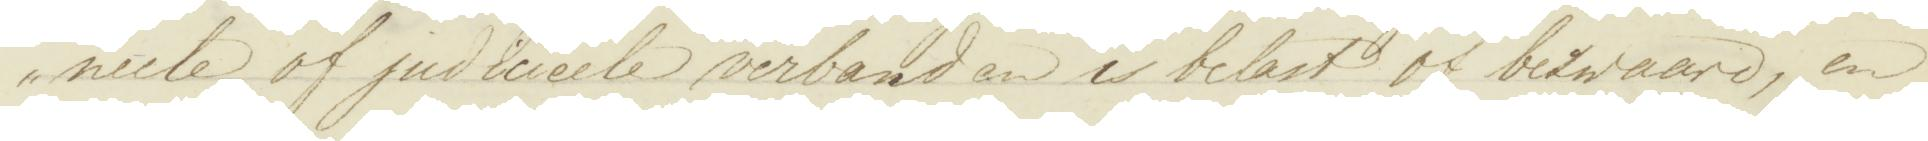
„neele of judicieele verbanden is belast of bezwaard, en
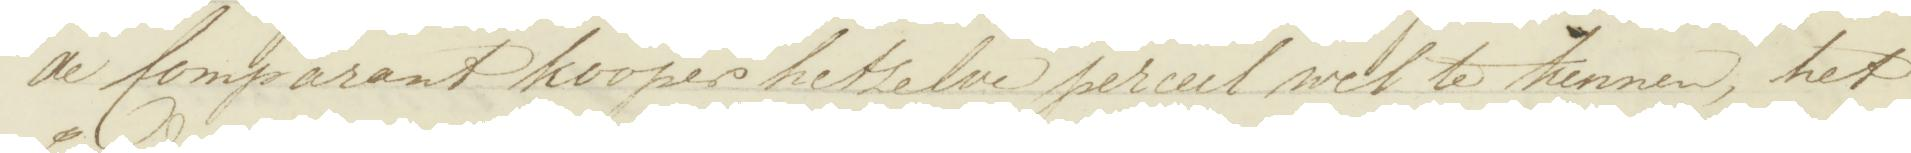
de Comparant kooper hetzelve perceel wel te kennen, het
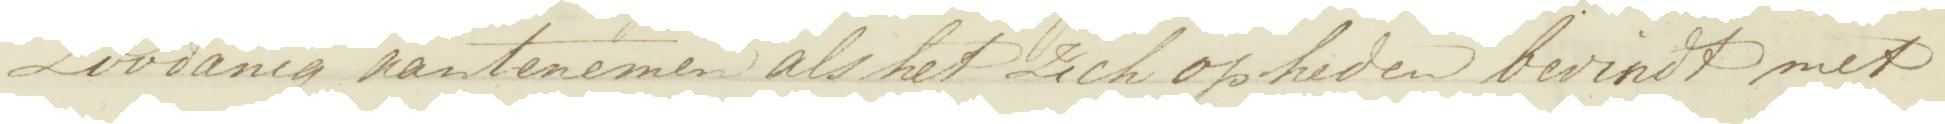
zoodanig aantenemen als het zich op heden bevindt met
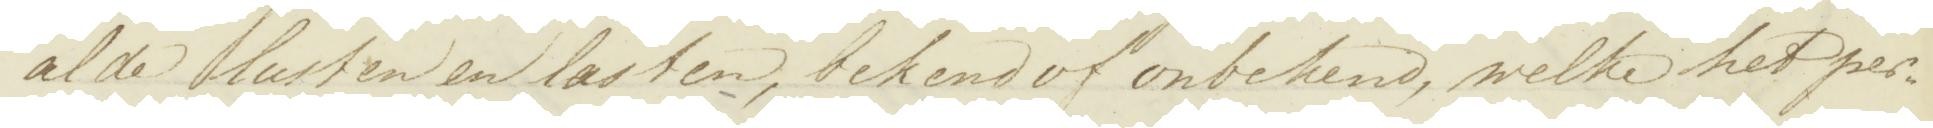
alde lusten en lasten, bekend of onbekend, welke het per„
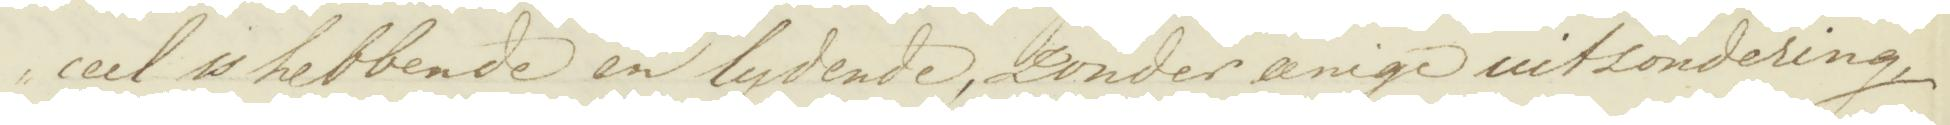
„ceel is hebbende en lydende, zonder eenige uitzondering,
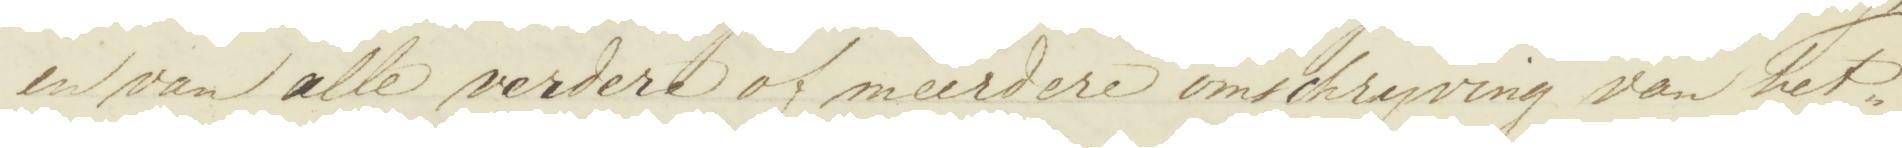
en van alle verdere of meerdere omschryving van het„
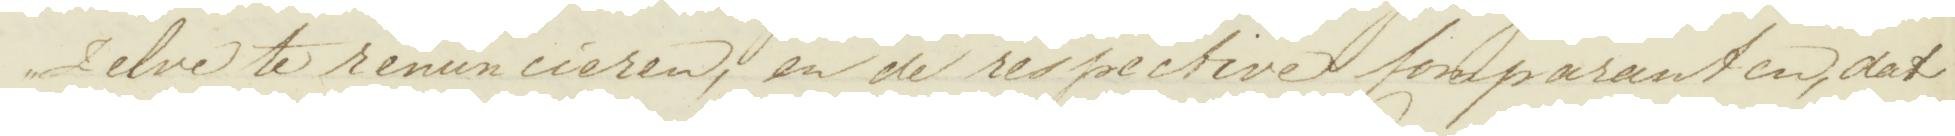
„zelve te renuncieren, en de respective comparanten, dat
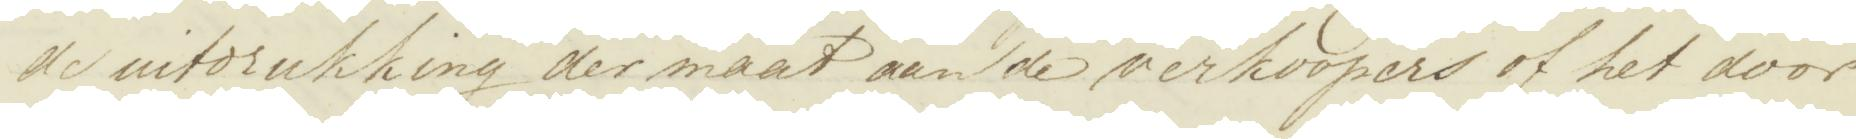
de uitdrukking der maat aan de verkoopers of het door
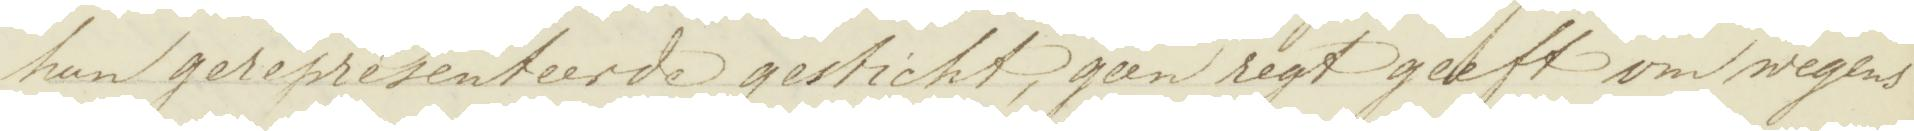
hun gerepresenteerde gesticht, geen regt geeft om wegens
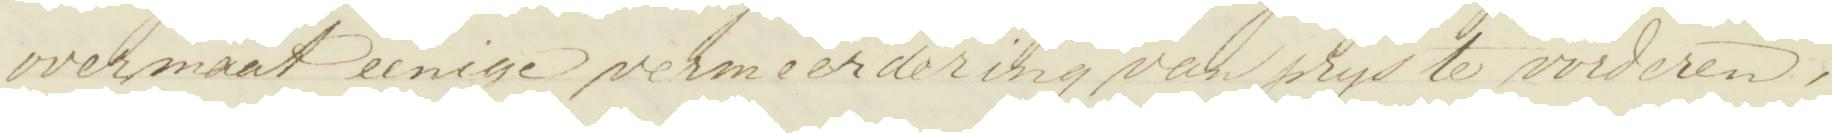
overmaat eenige vermeerdering van prys te vorderen,
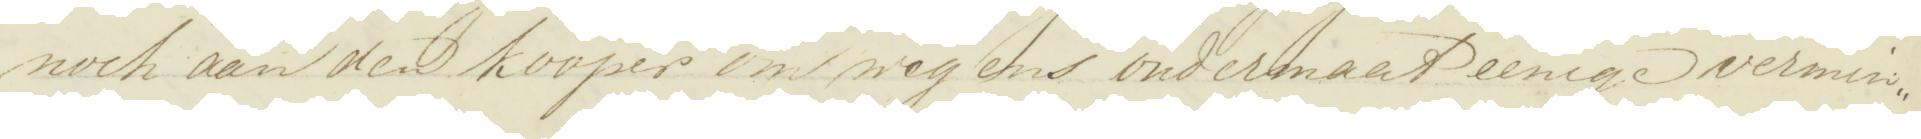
noch aan den kooper om wegens ondermaat eenige vermin„
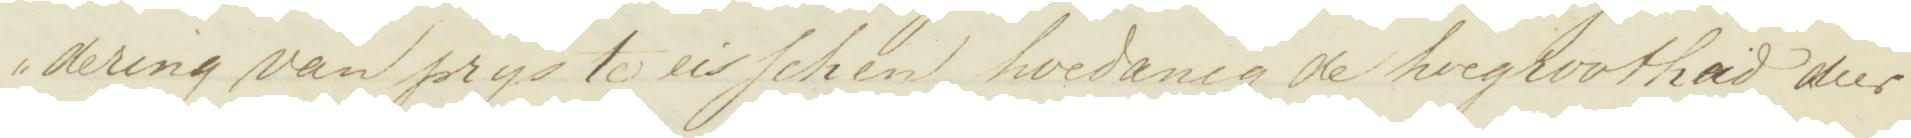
„dering van prys te eisschen hoedanig de hoegrootheid dies
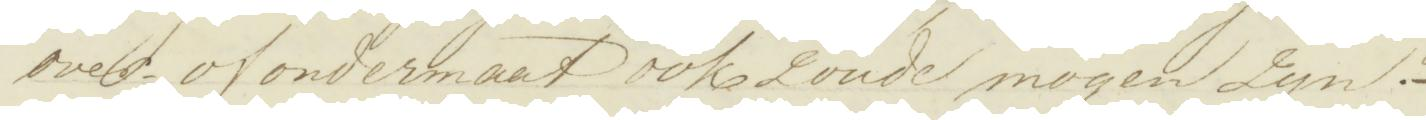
over- of ondermaat ook zoude mogen zyn.
